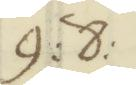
9: 8.
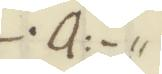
. 4: – „
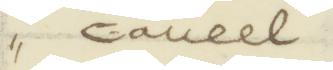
„ caneel
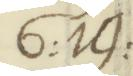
6:19
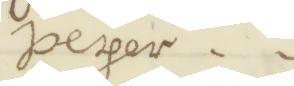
peper - -
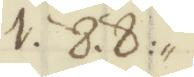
1. 8.8:„
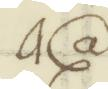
4@
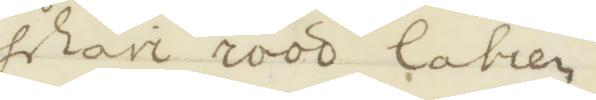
schair rood laken
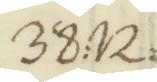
38:12
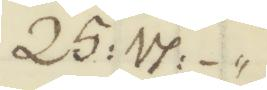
25: 17: – „
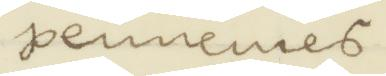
pennemes
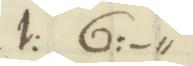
1: 6:–„
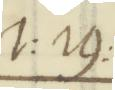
1: 19
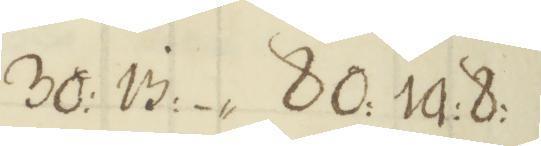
30: 13: –„ 80:14:8:
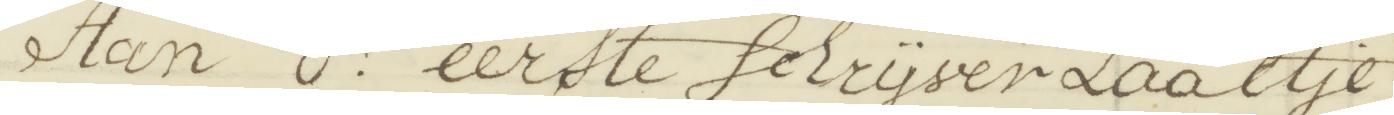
Aan d:o eerste schrijver Laaltje
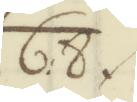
ƒ . . — . 6:8ƒ
